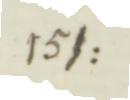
151:
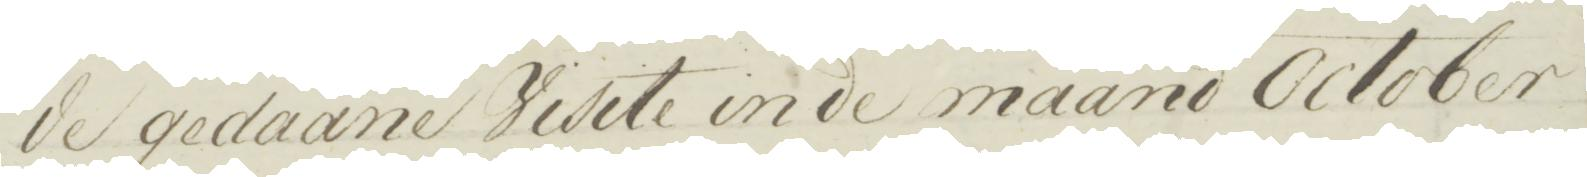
de gedaane Visite in de maand October
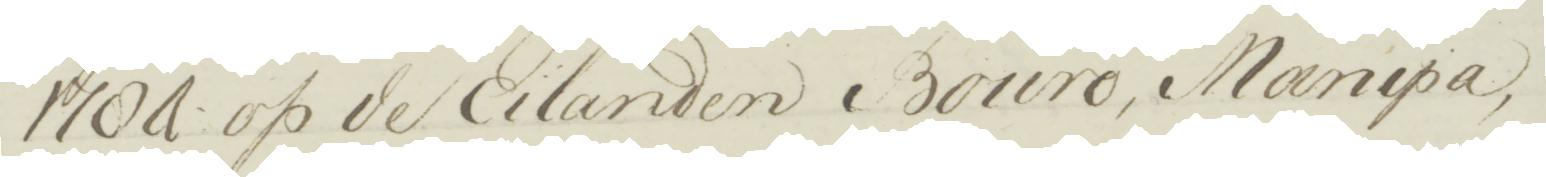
1784: op de Eilanden Bouro, Manipa,
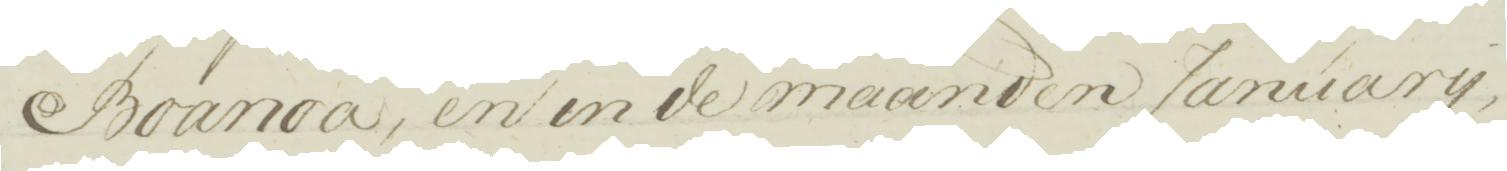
Boanoa, en in de maanden Januarij,
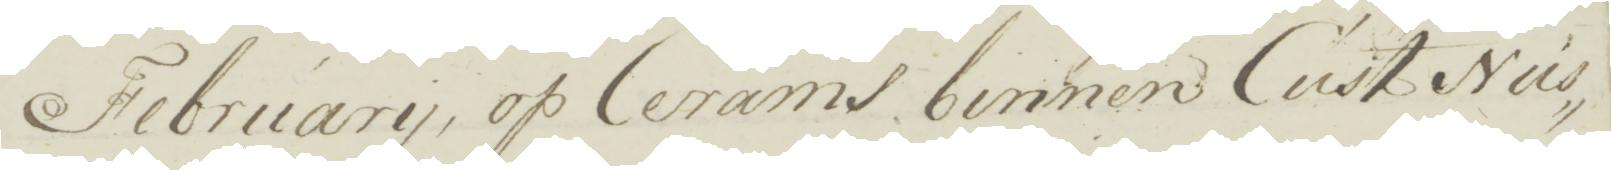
Februarij, op Cerams binnen Cust Nus„
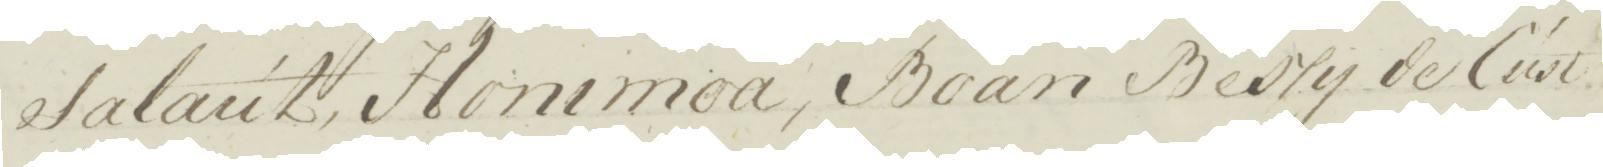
salaut, Honimoa, Boan Besly de Cust
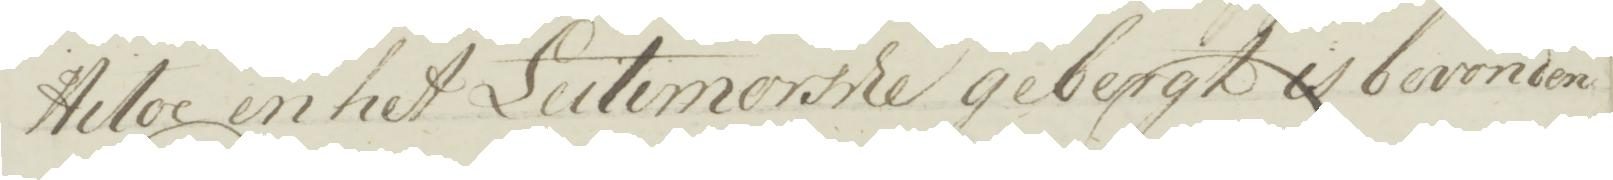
Hitoe en het Leitimorsche gebergt is bevonden
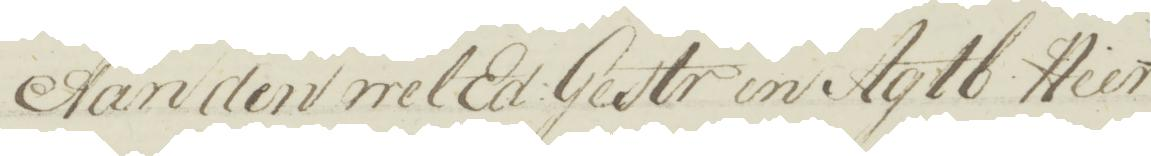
Aan den wel Ed: Gestr en Agtb: Heer
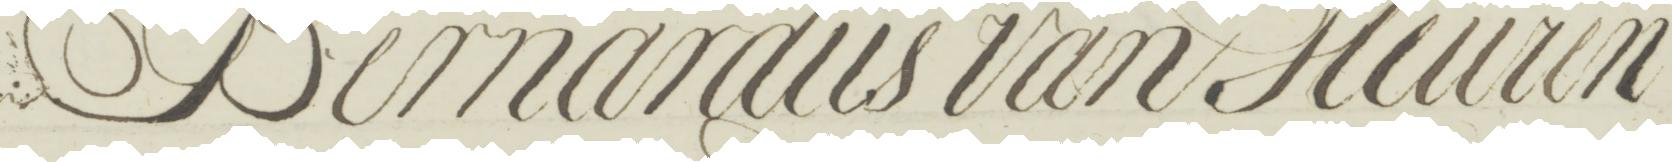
Bernardus van Pleuren
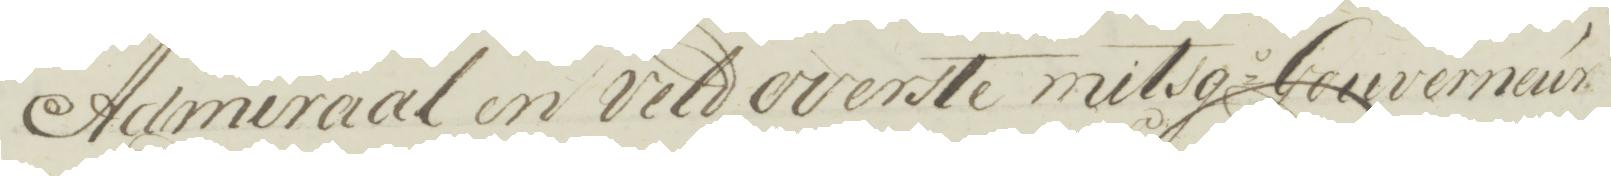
Admiraal en veld overste mitsg=s Gouverneur
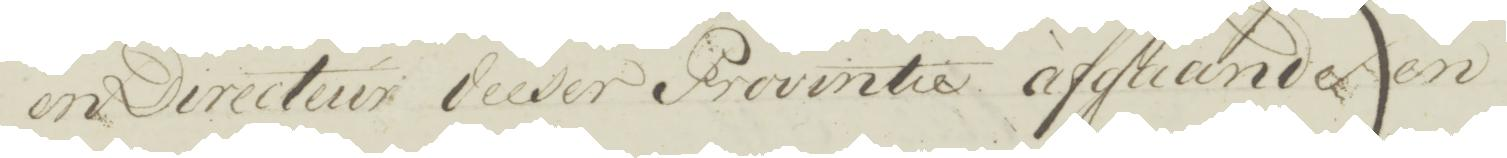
en Directeur deeser Provintie afgaande en
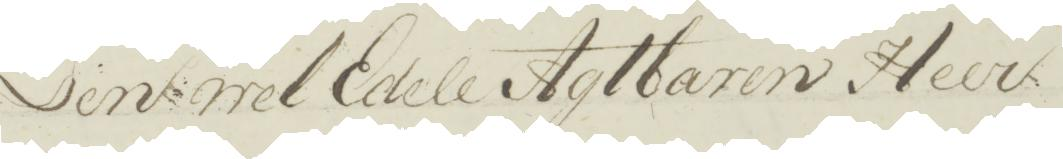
Den wel Edele Agtbaren Heer
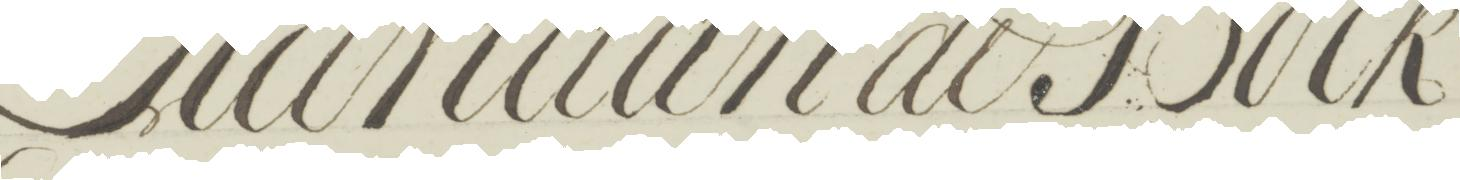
Adriaan de Bock
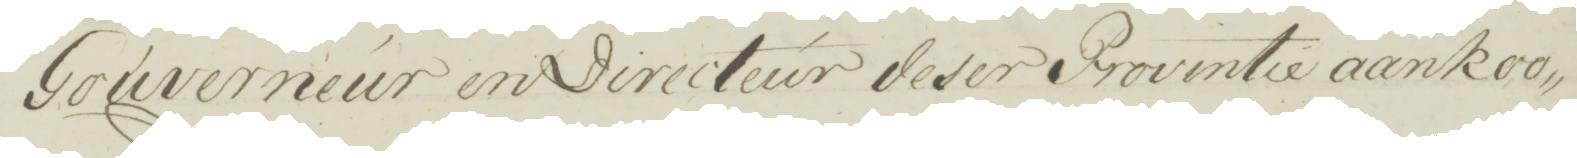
Gouverneur en Directeur deser Provintie aankoo„
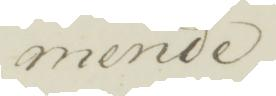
mende
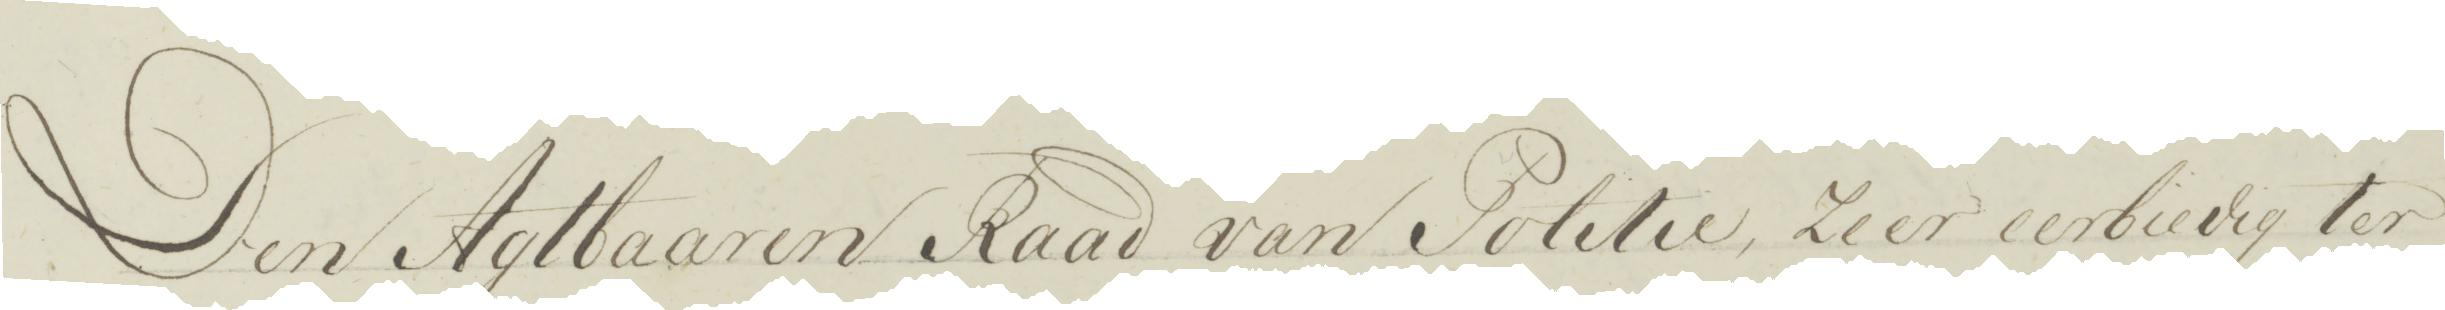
Den Agtbaaren Raad van Politie, zeer eerbiedig ter
